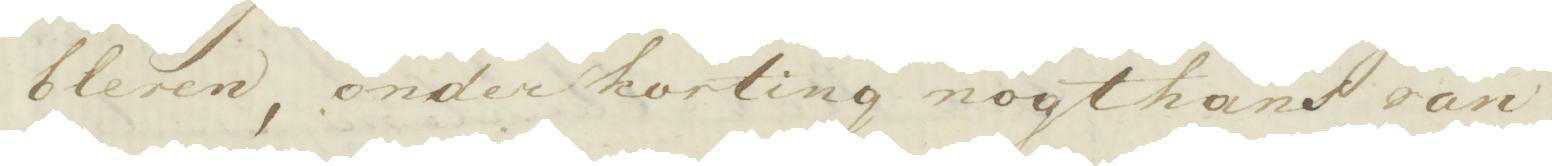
bleven, onder korting nogthans van
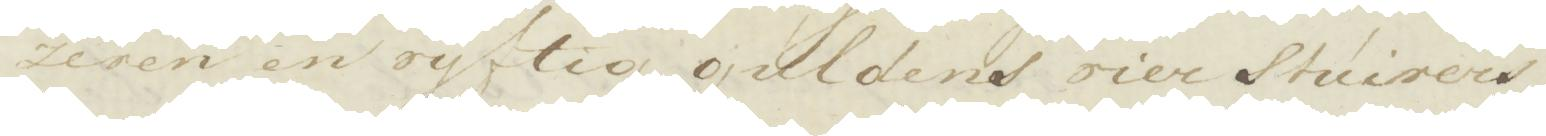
zeven en vyftig guldens vier stuivers
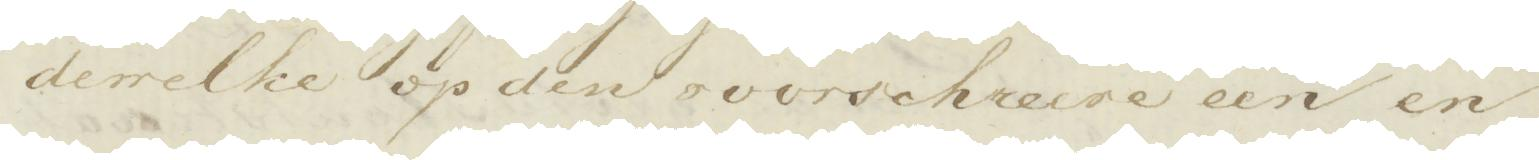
dewelke op den voorschreeve een en
